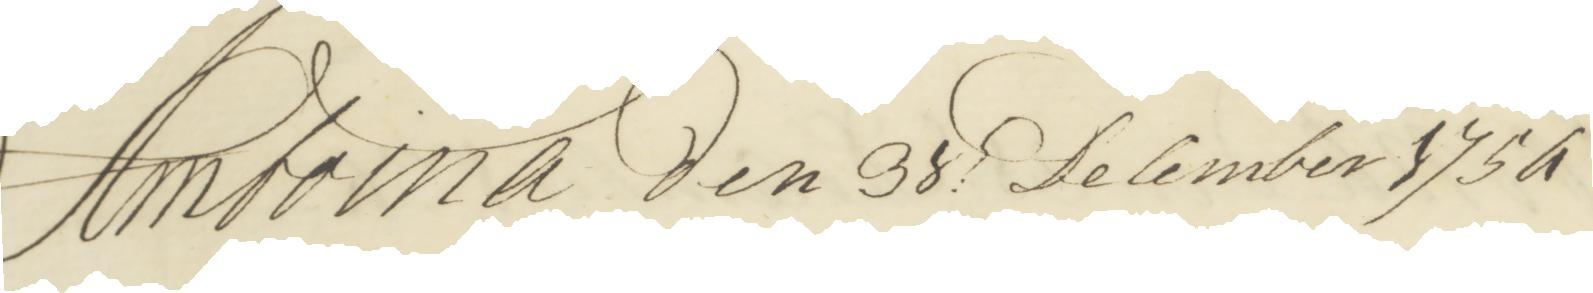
Amboina den 31:e December 1754
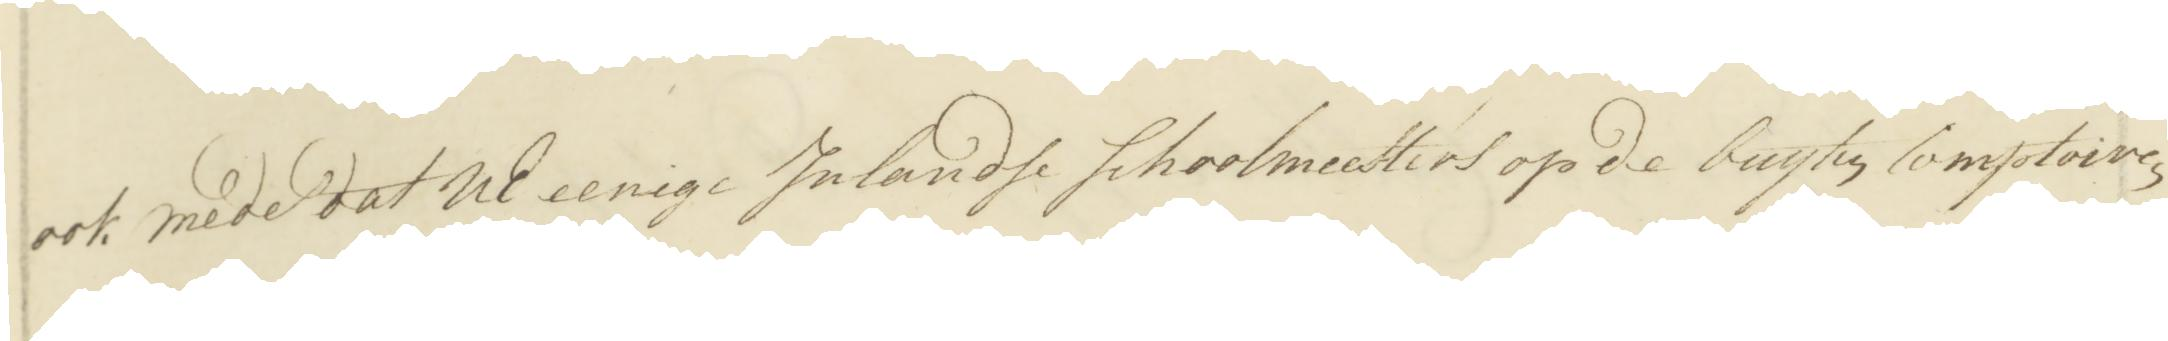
ook mede dat UE eenige Jnlandse schoolmeesters op de buyten comptoiren
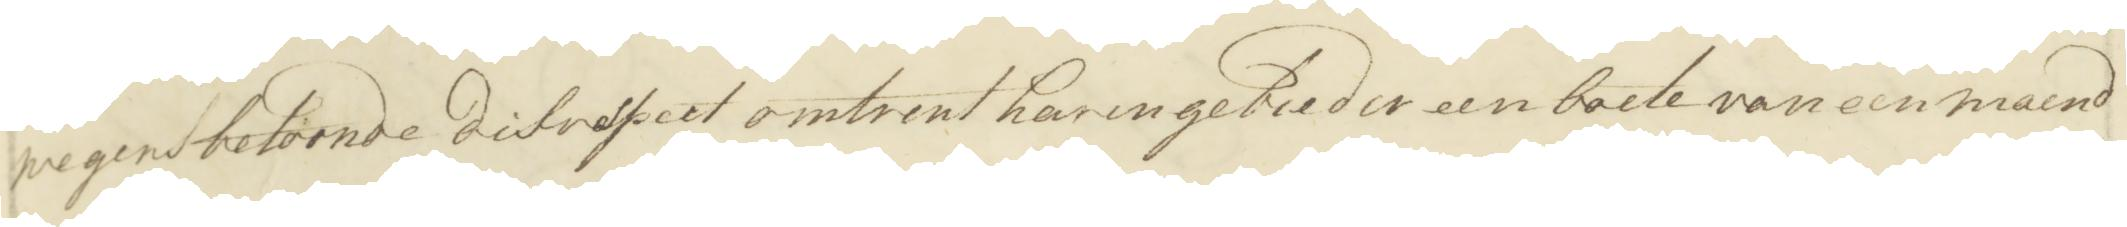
wegens betoonde disrespect omtrent haren gebieder een boete van een maend
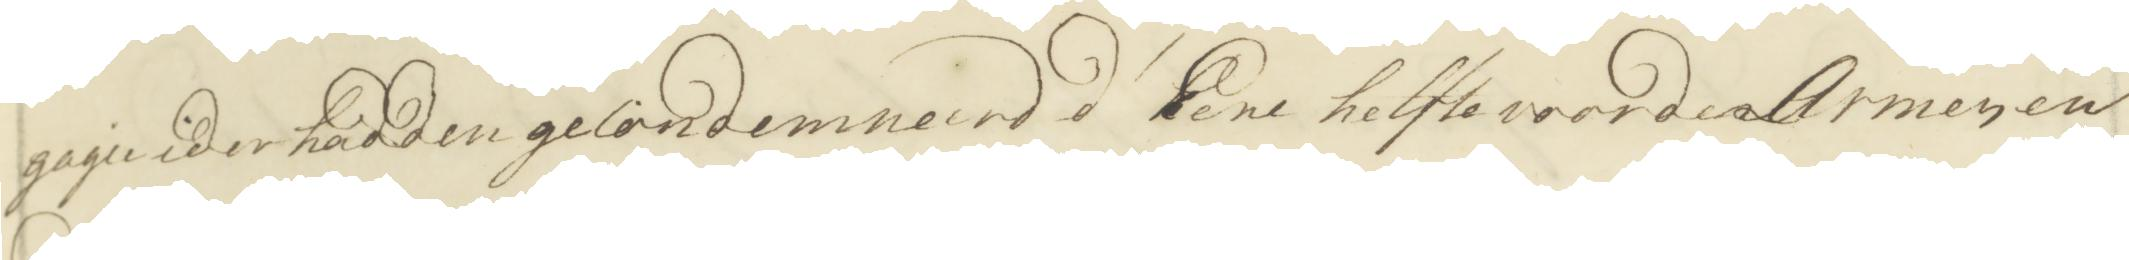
gagie ider hadden gecondemneerd d’ Eene helfte voor de Armen
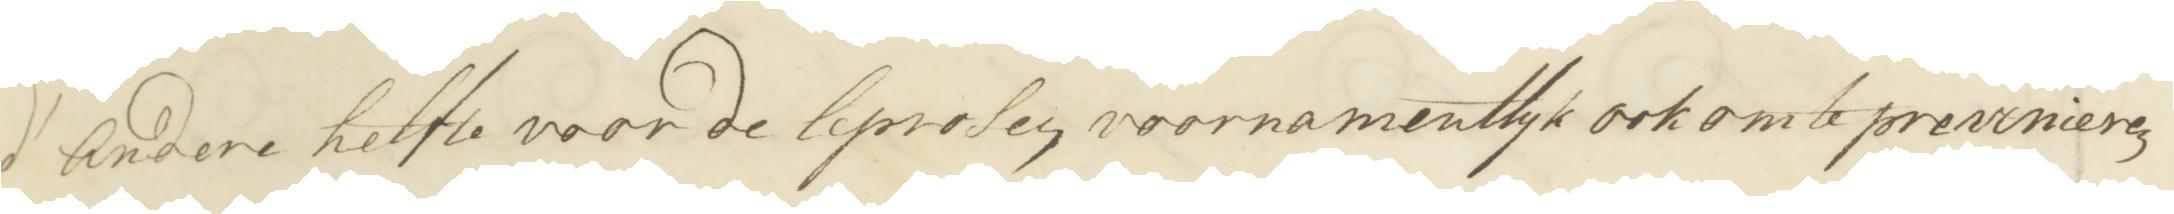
d' andere helfte voor de leprosen voornamentlyk ook om te prevenieren
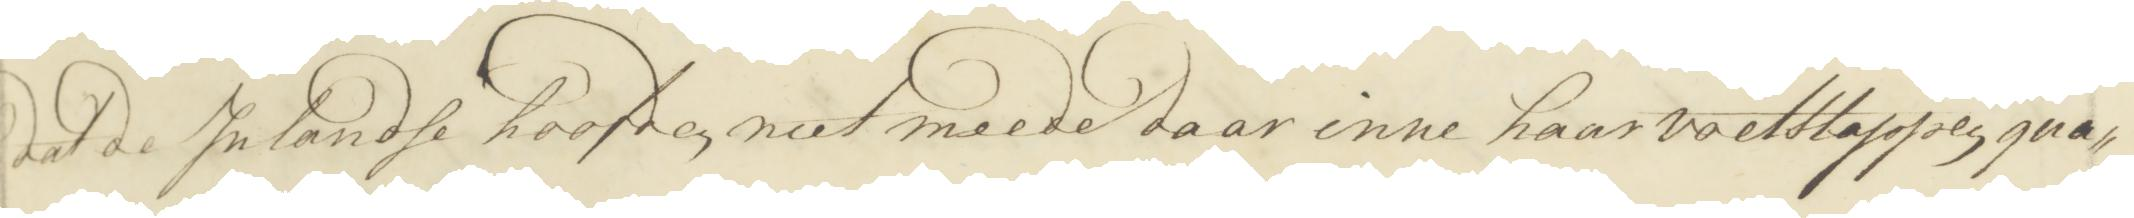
dat de Jnlandse hoofden niet meede daar inne haar voetstappen qua„
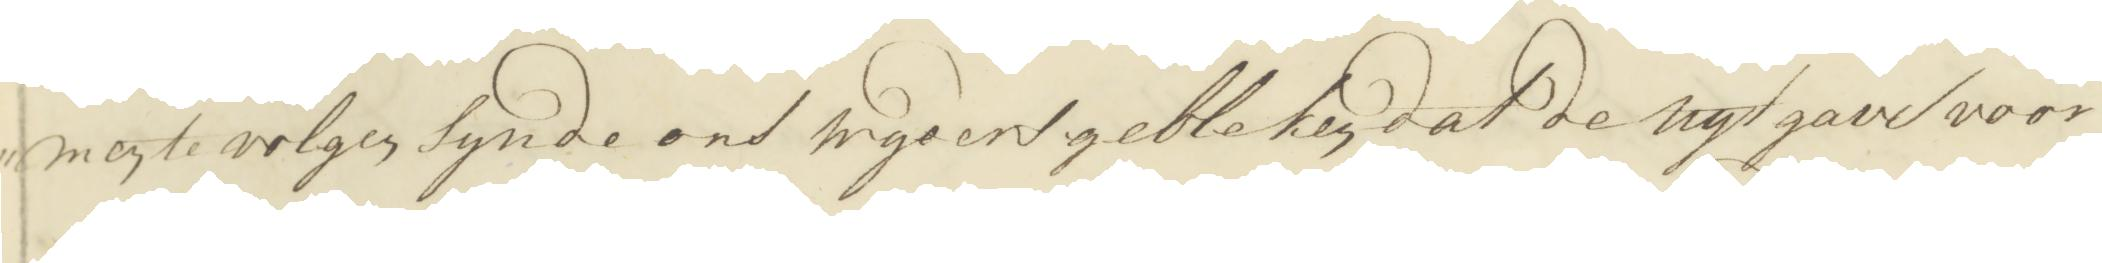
„men te volgen synde ons wyders gebleken dat de uyt gave voor
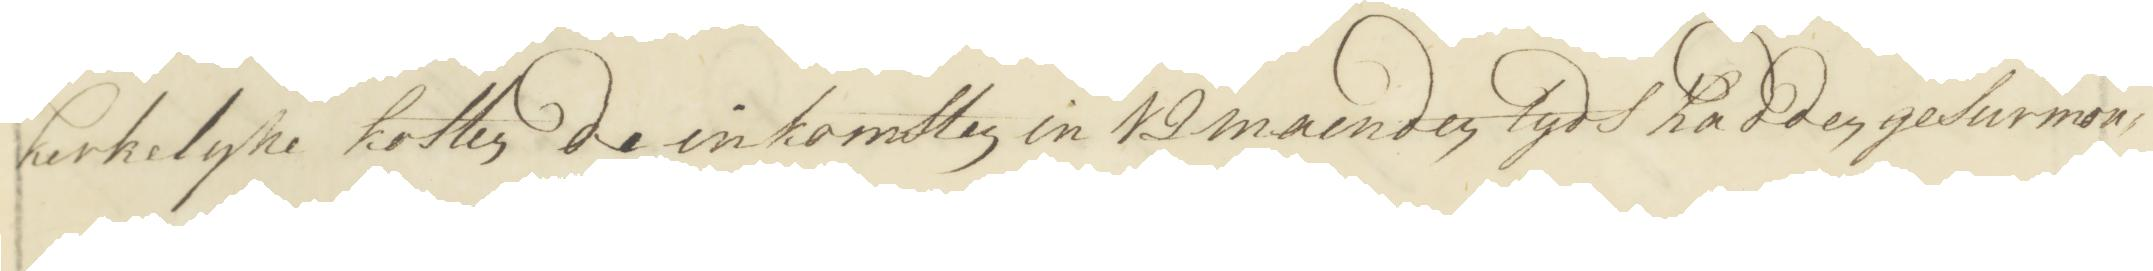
kerkelyke kosten de inkomsten in 12 maenden tyds hadden gesurmon„
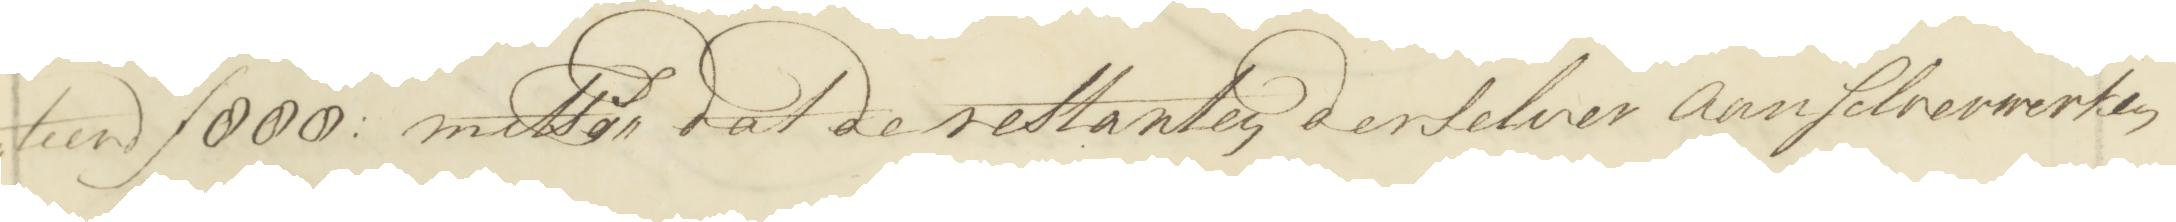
teerd ƒ 888: mittg„s dat de restanten derselver aan selve werken
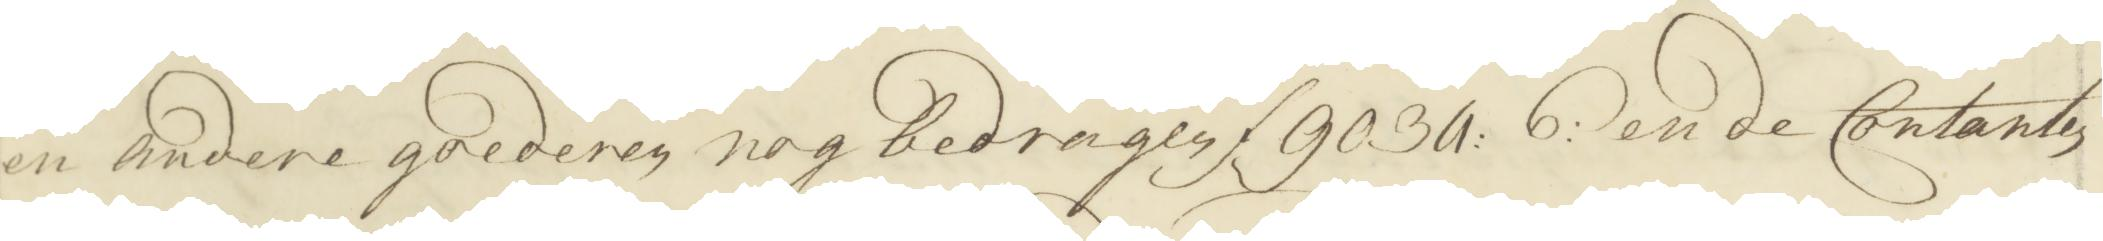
en andere goederen nog bedragen ƒ 9034:6: en de contanten
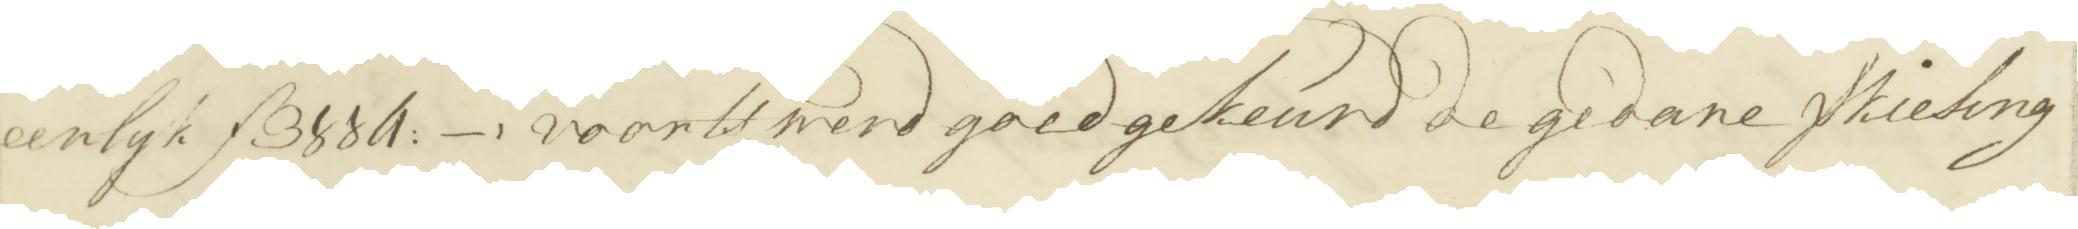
eerlyk ƒ 3114: -: voorts werd goedgekeurd de gedane verkiesing
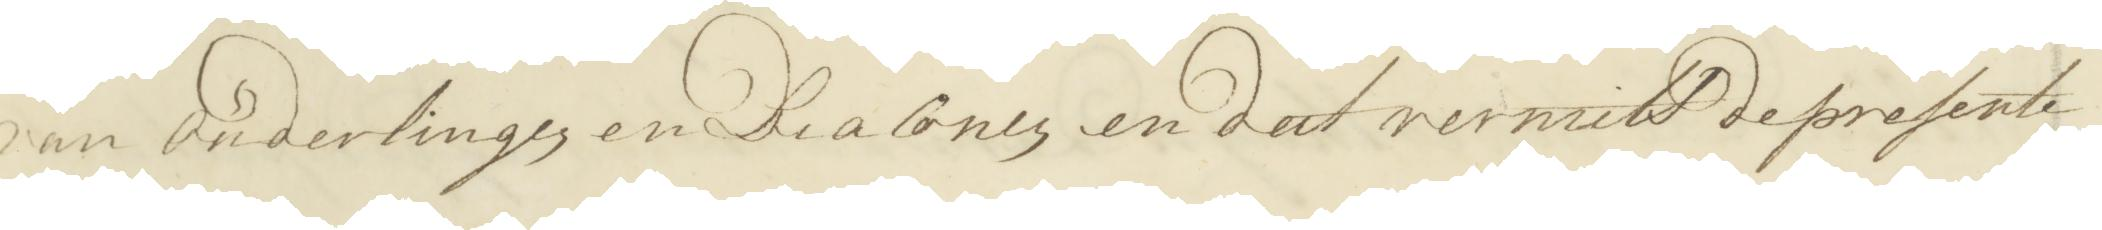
van ouderlingen en Diacenen en dat vermits de presente
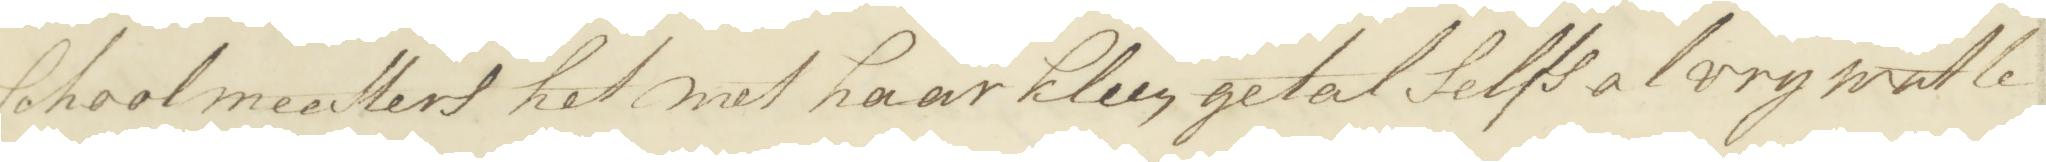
schoolmeesters het met haar kleen getal selfs al vry wat te
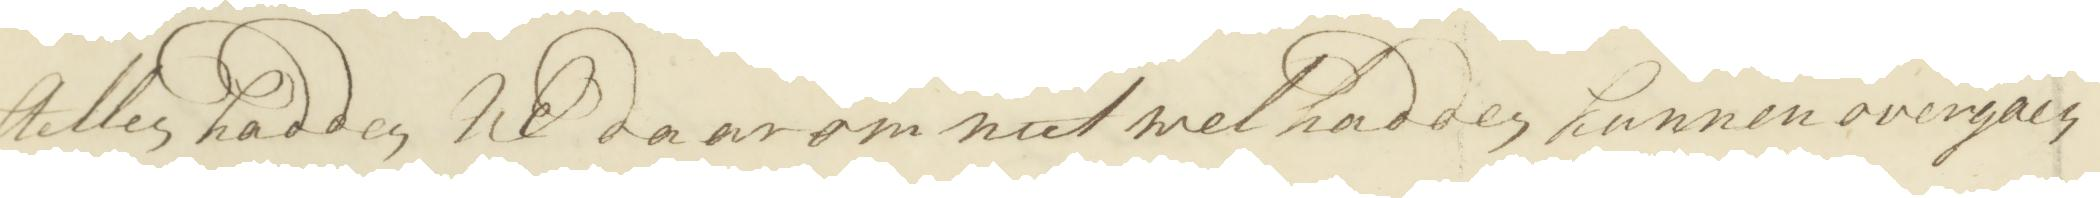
stellen hadden UE daar om niet wel hadden kunnen overgaen
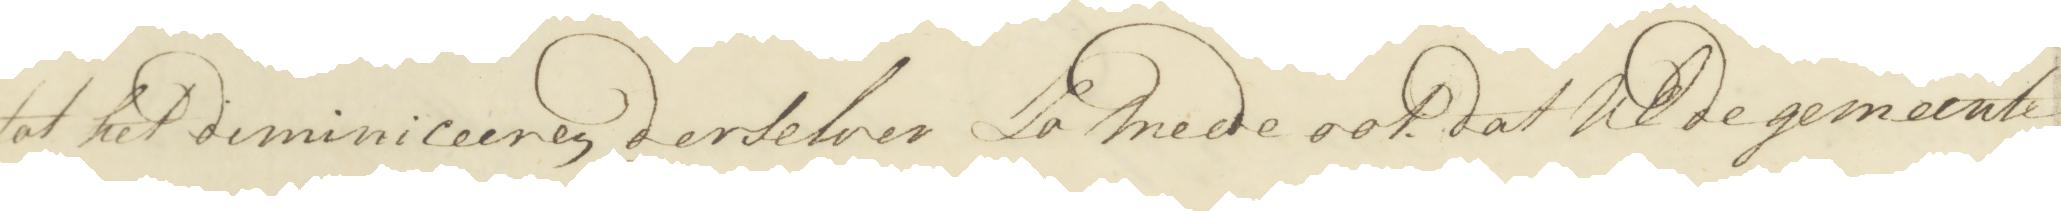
tot het diminiceeren derselver Zo mede ook dat UE de gemeente
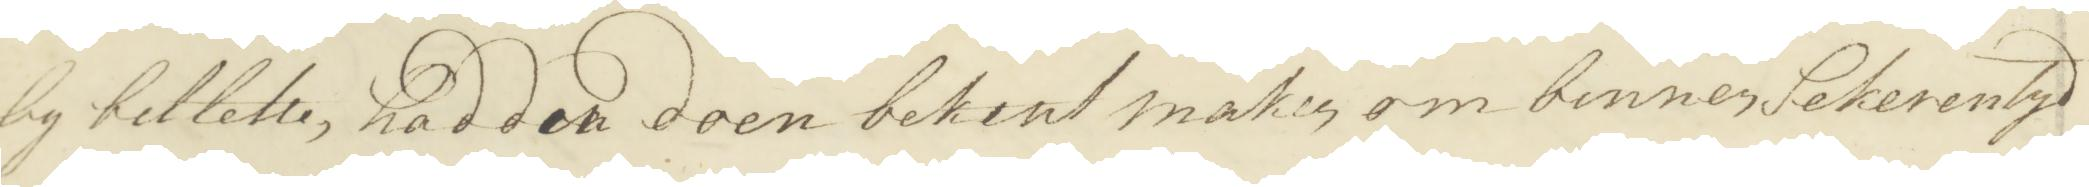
by billetten hadden doen bekent maken om binnen sekeren tyd
